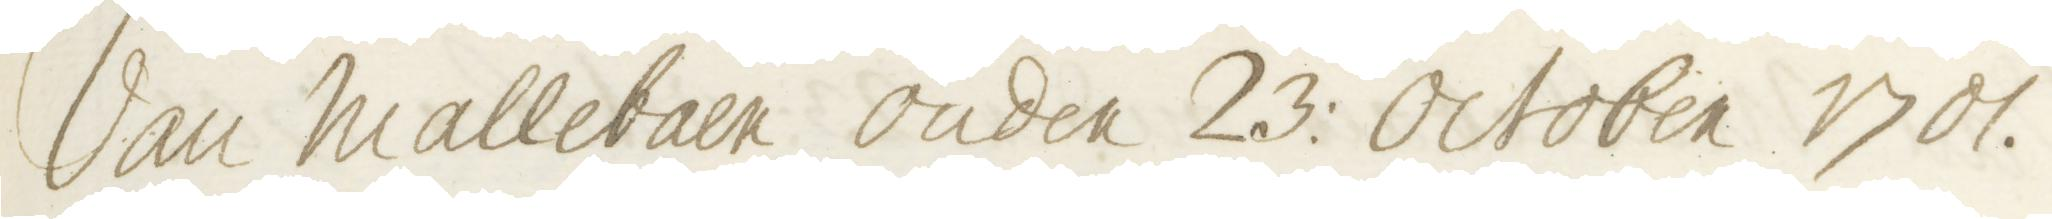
Van Mallebaer onder 23: October 1701.
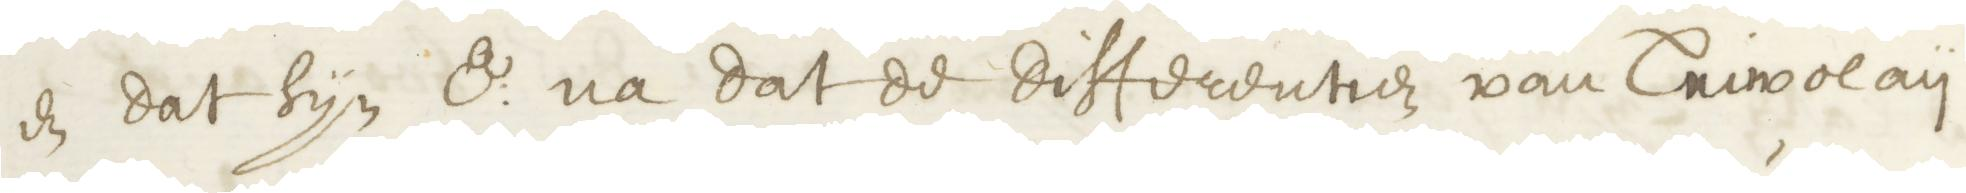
en dat sijn E: na dat de differentien van Triwolaij
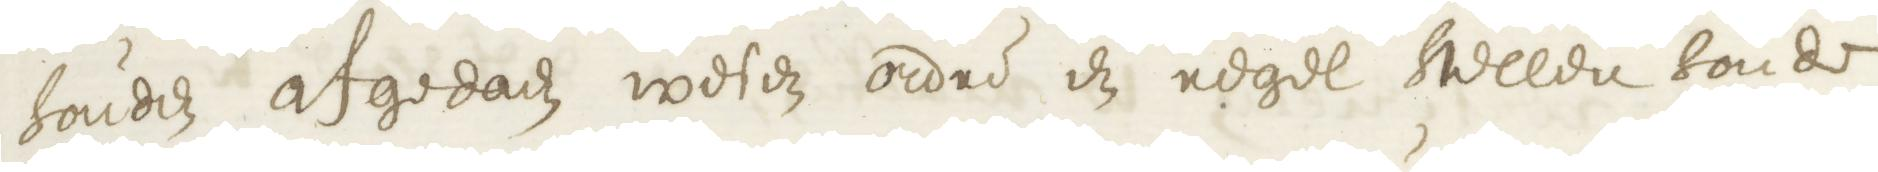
souden afgedaen wesen ordre en regel stellen soude,
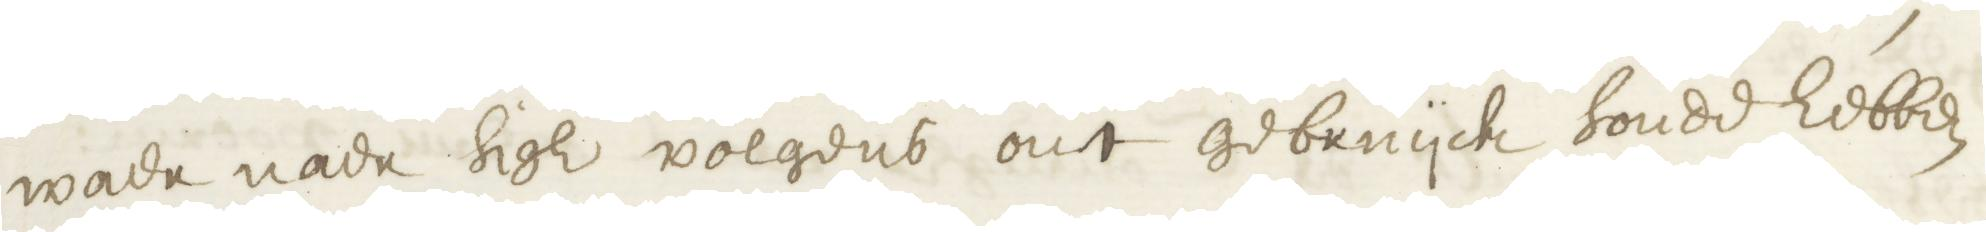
waer naer sigh volgens out gebruijck soude hebben
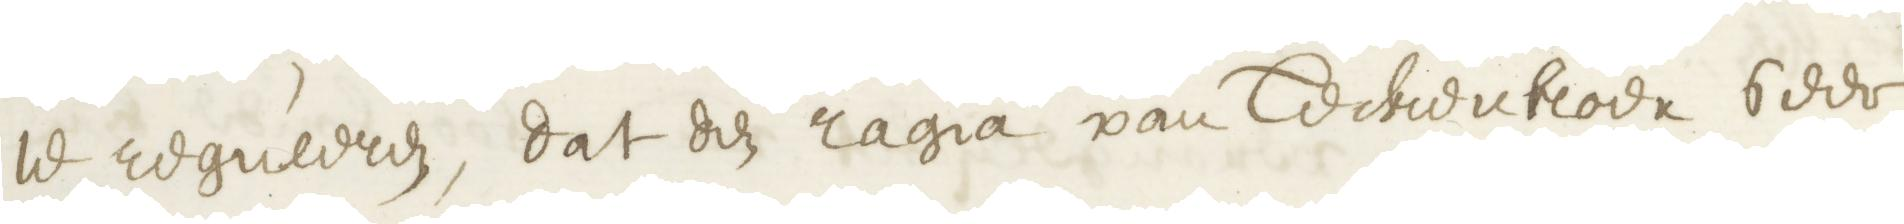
te reguleren, dat den ragia van Teckenkoer seer
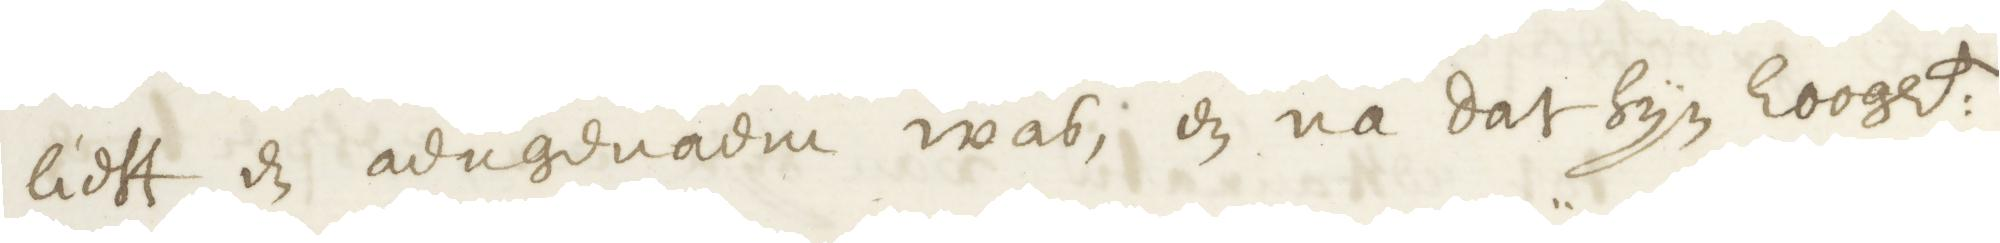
lieft en aengenaem was; en na dat sijn hoogh:t
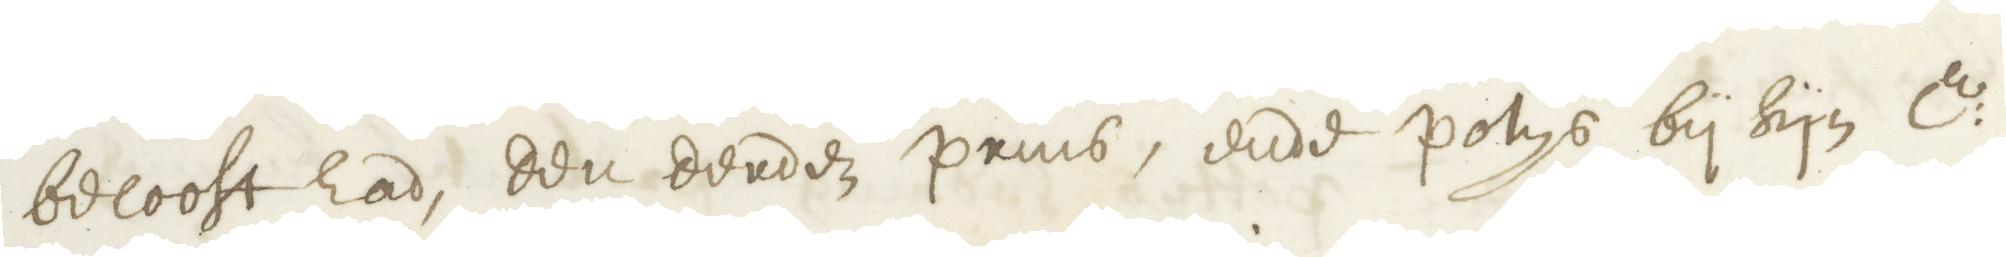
belooft had, den derden prins, ende potijs bij sijn C:'
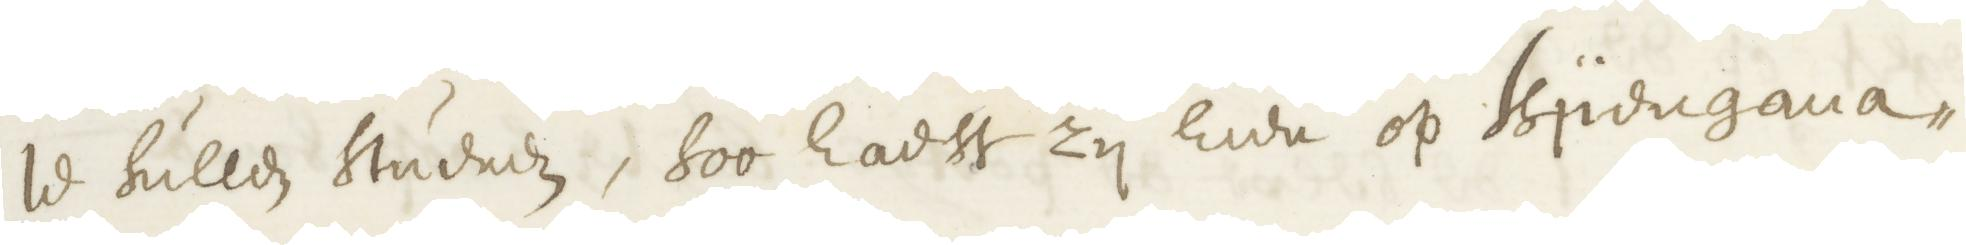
te sullen stueren, soo haest zij hier op tsjiengana„
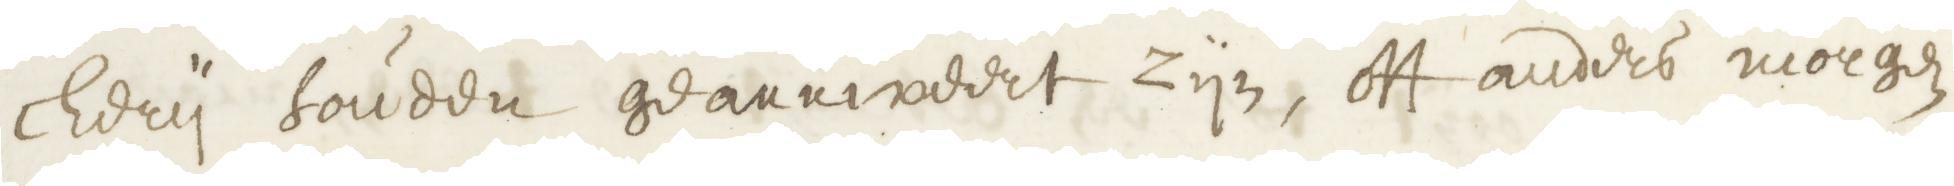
cherij souden gearriveert zijn, off anders morgen
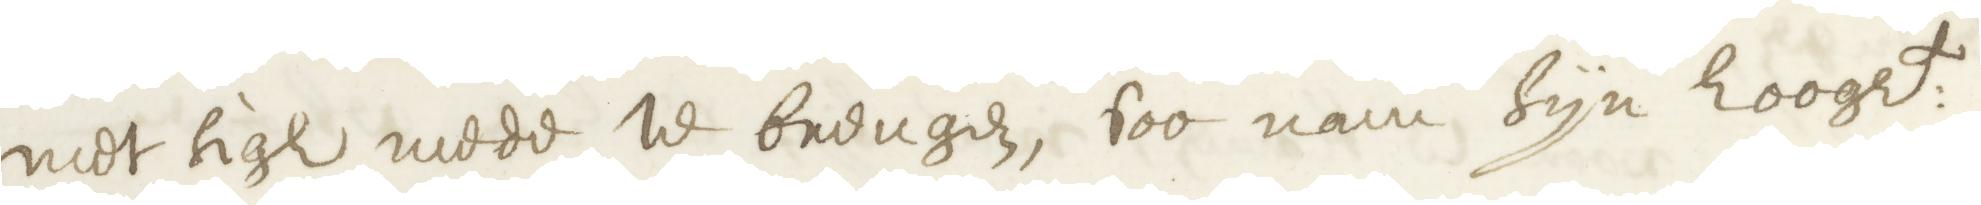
met sigh mede te brengen, soo nam sijn hoogh:t
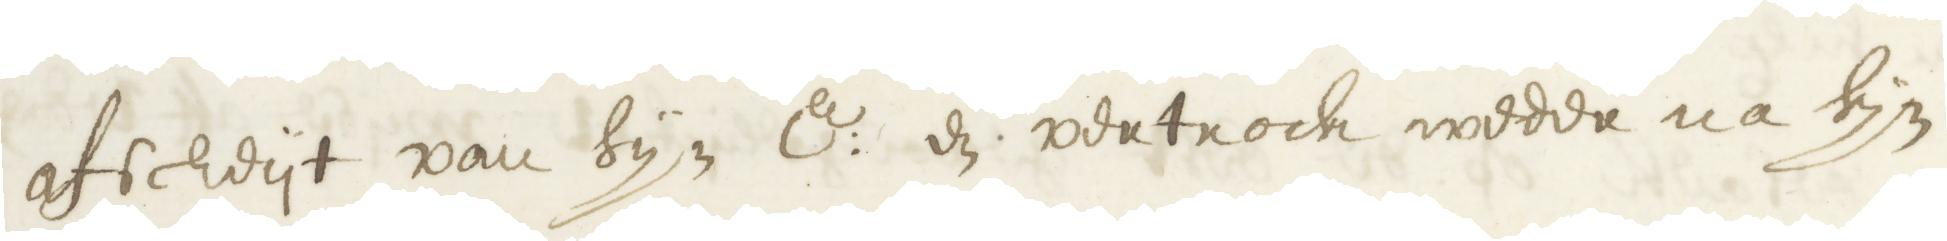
afscheijt van sijn E: en vertrock weder na sijn
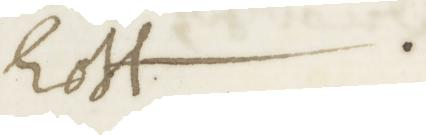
hoff.
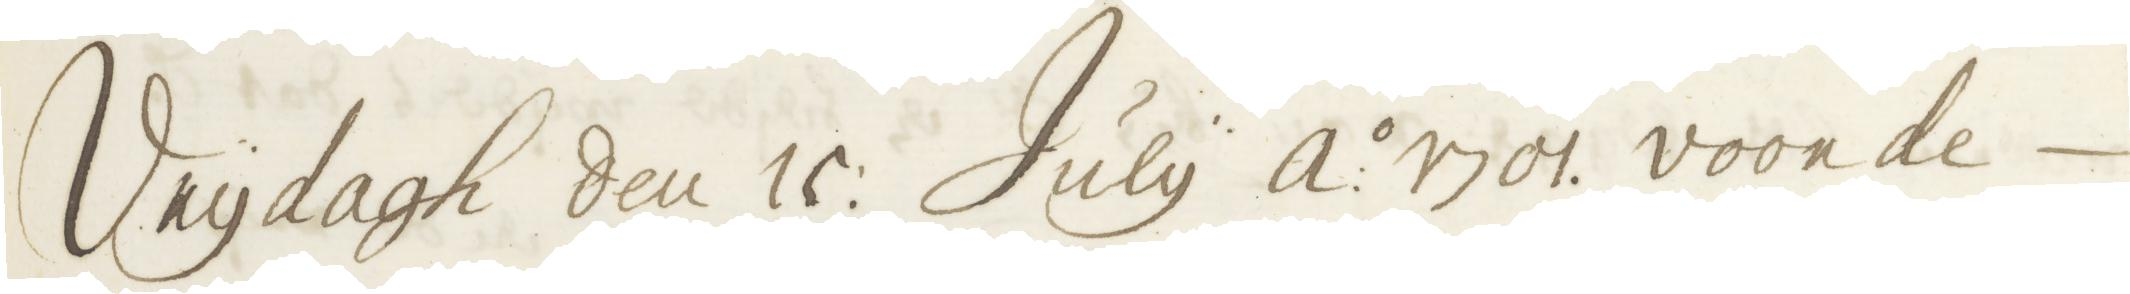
Vrijdagh den 15: Iulij A:o 1701. voor de —
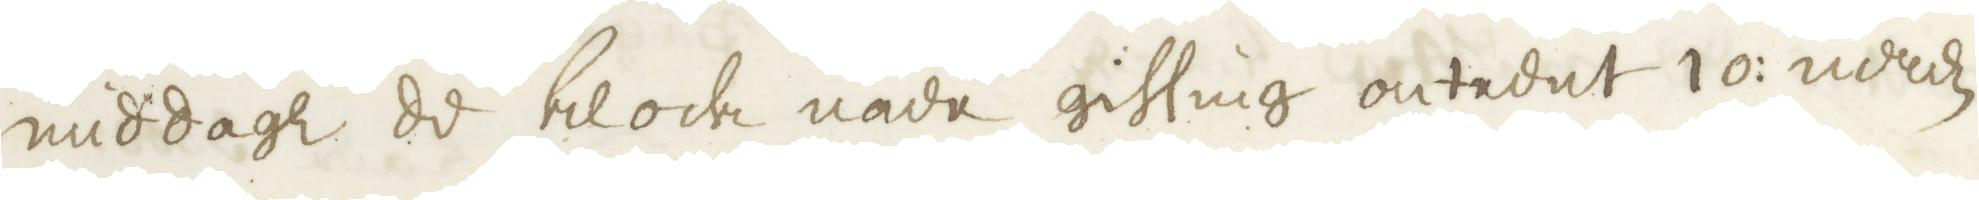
middagh de klock naer gissing ontrent 10: ueren
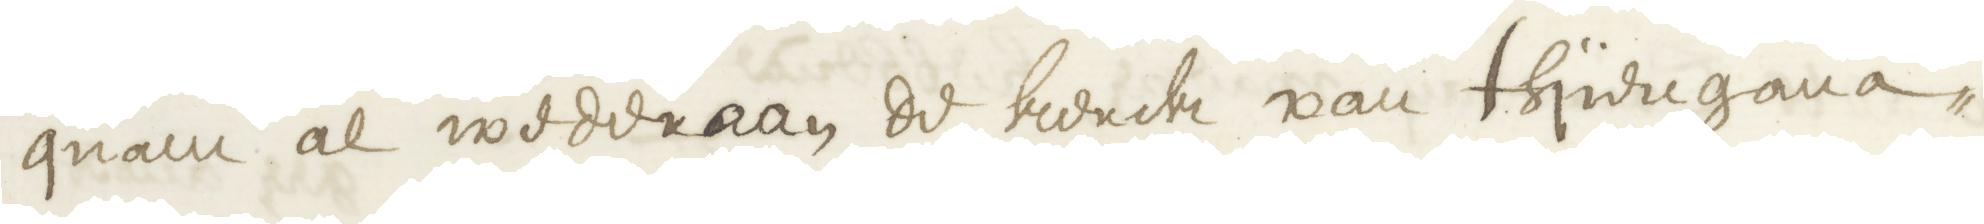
quam al weder aan de kerck van tsjiengana„
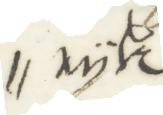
„rijk
